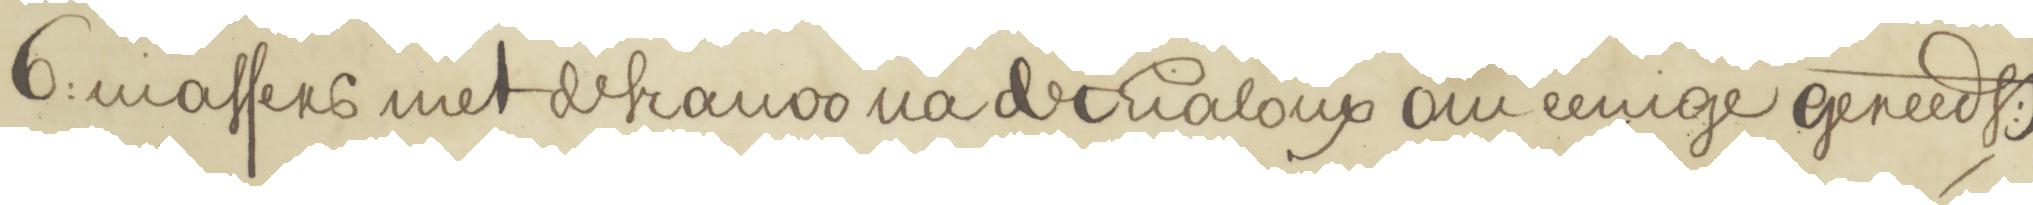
6: niassers met de kanoo na de chialoup om eenige gereeds:
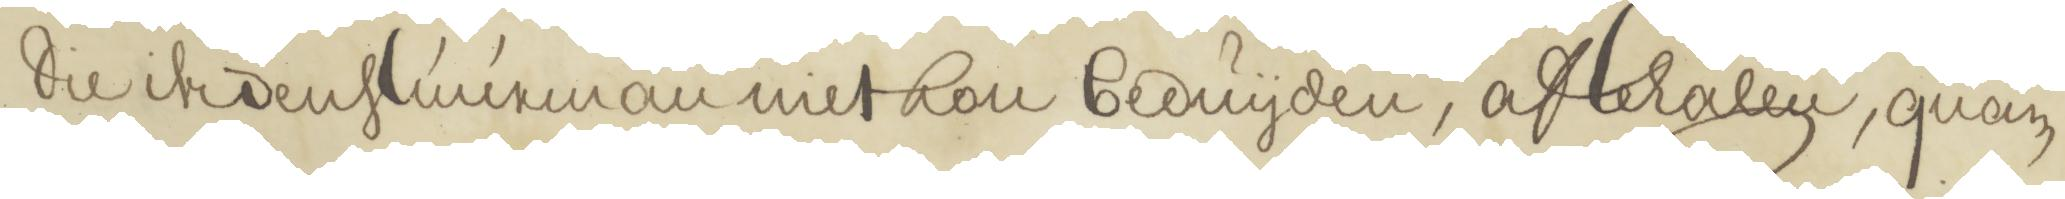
die ik den stuurman niet kon beduijden, aftehalen, quam
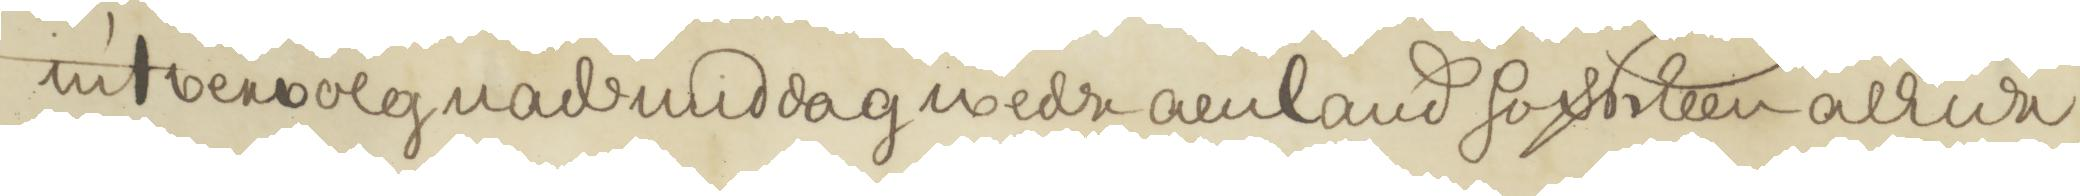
in't vervolg nademiddag weder aen land so verscheen alhier
